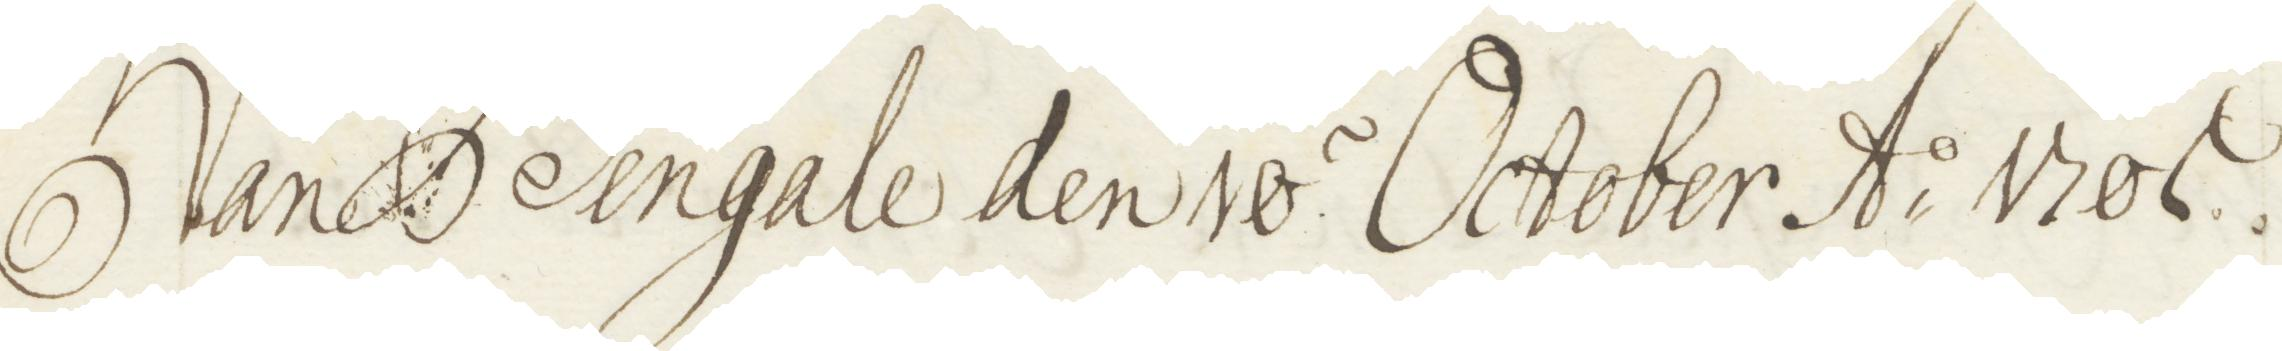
Van Bengale den 10:' October A„o 1705.
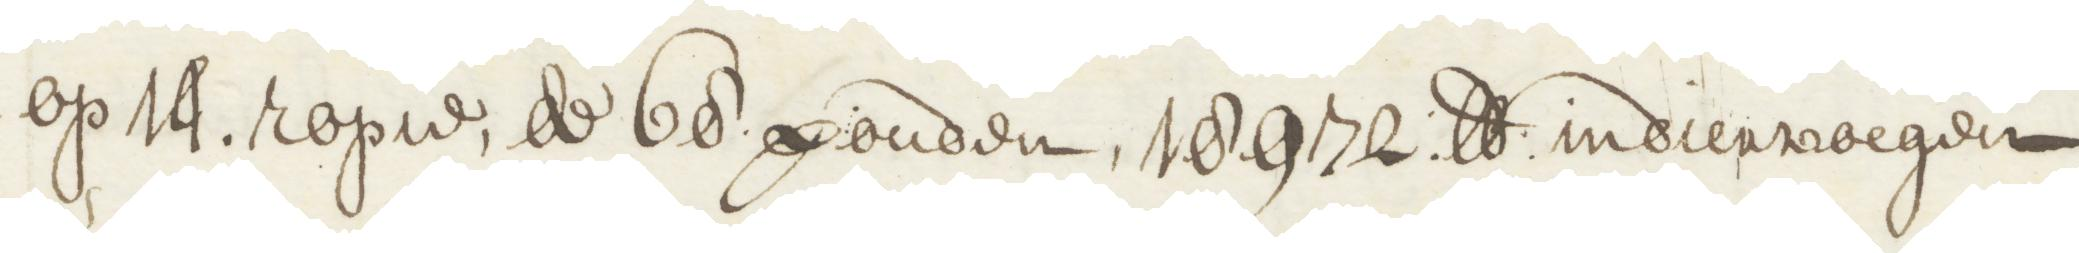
op 14. ropie; de 68. ponden, 18972: lb: in dier voegen
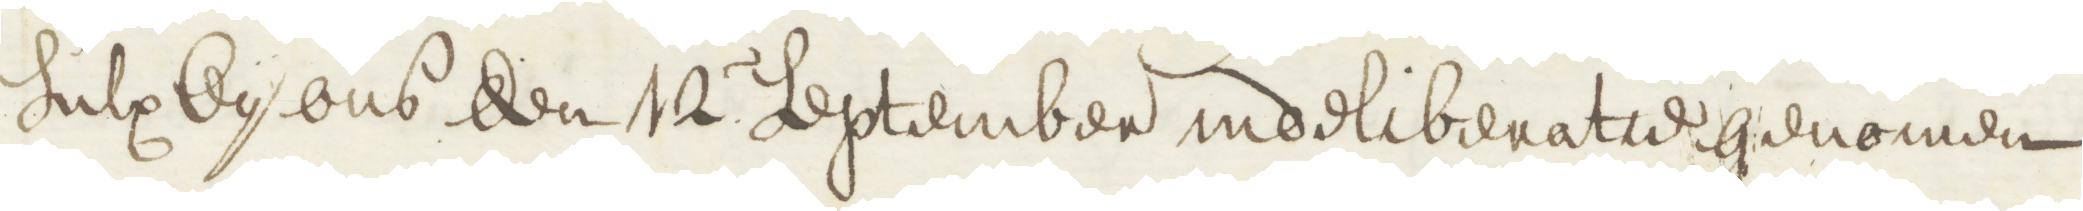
sulx bij ons den 12' september in deliberatie genomen
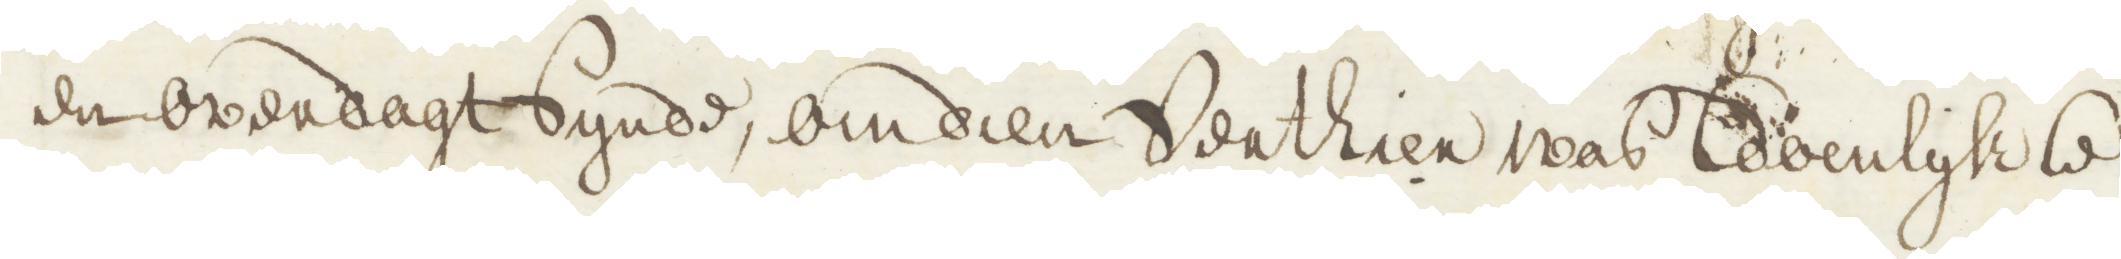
en overdagt synde, om dien verthier was t doenlijk te
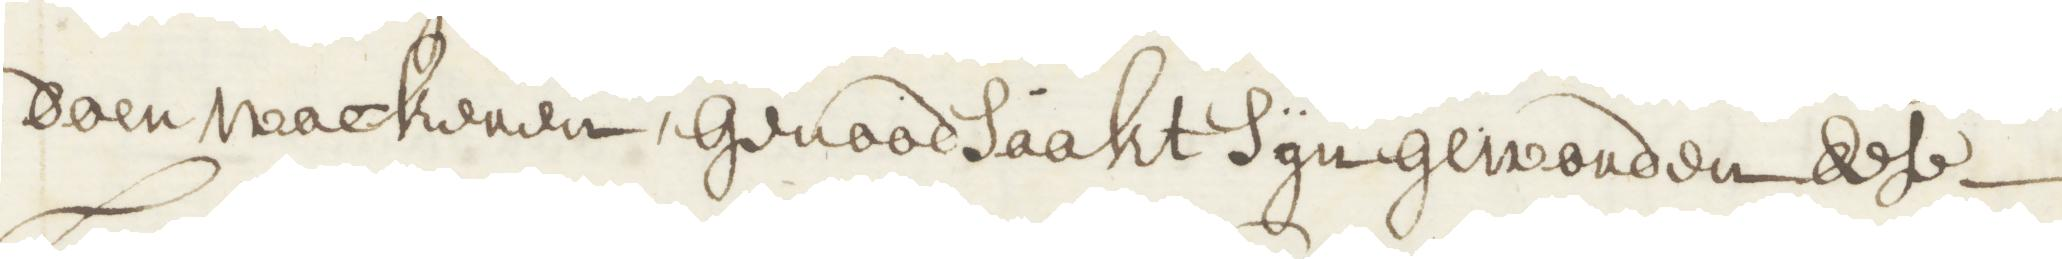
doen wackeren, genoodsaakt sijn geworden dese —
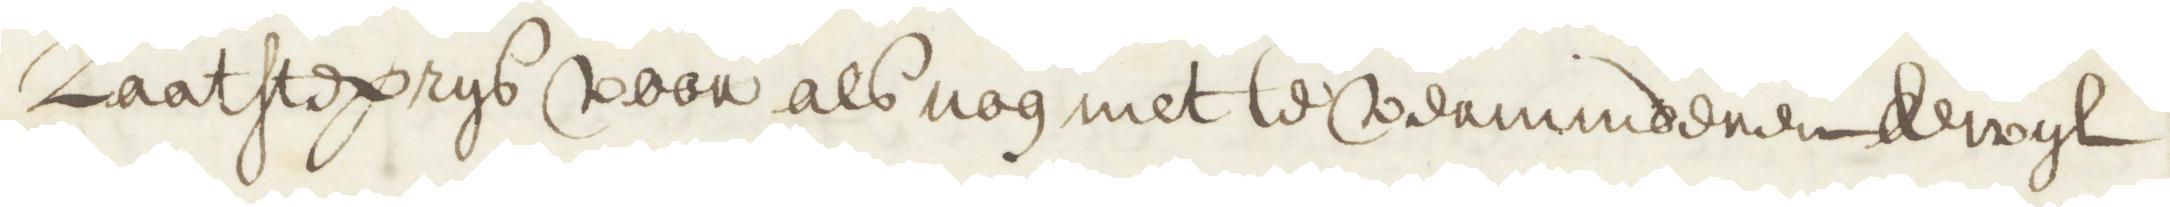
Laatste prijs voor als nog met te verminderen dewijl
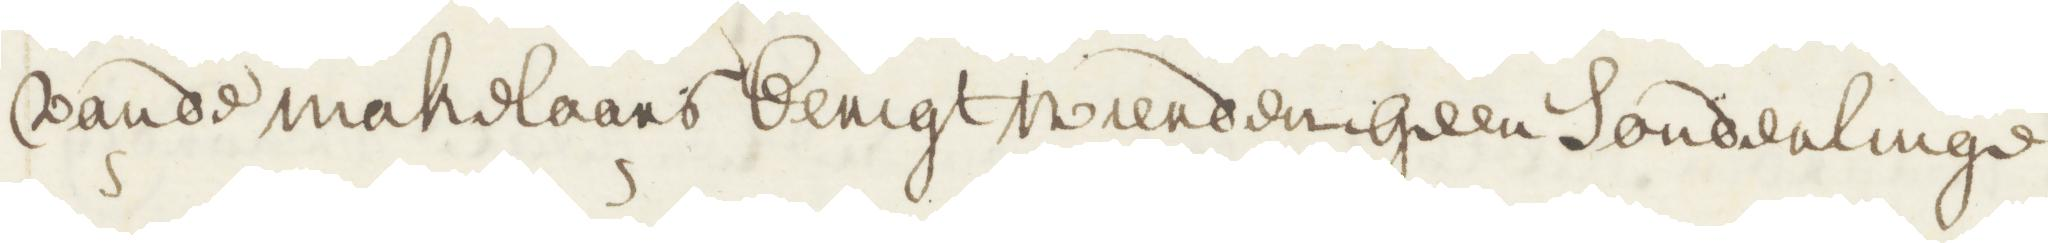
vande makelaars berigt wierden geen sonderlinge
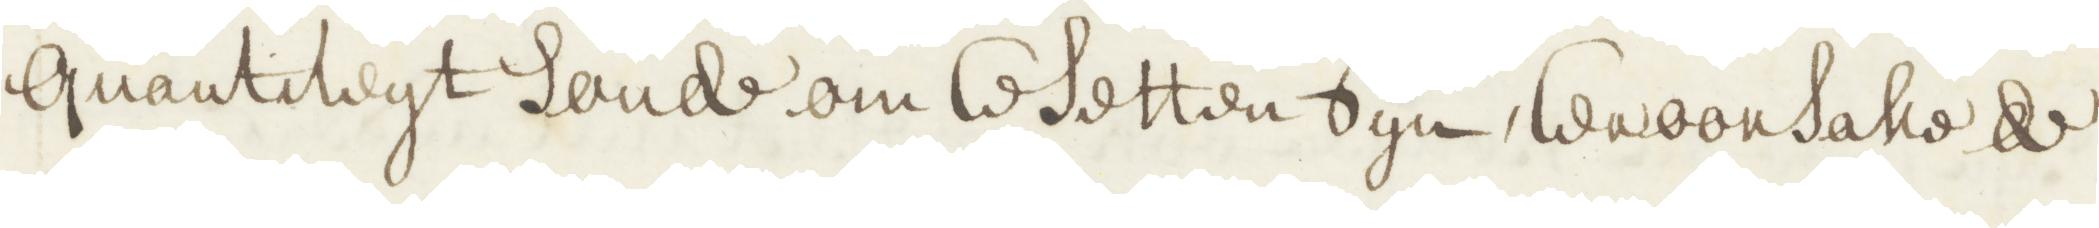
quantiteijt soude om te setten sijn, ter oorsake de
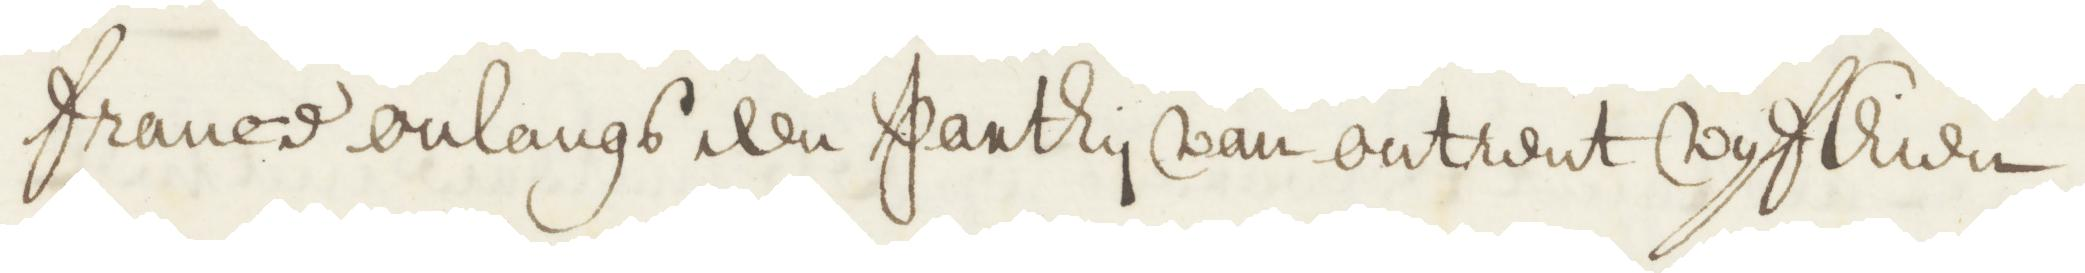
france onlangs een parthij van ontrent vijfthien
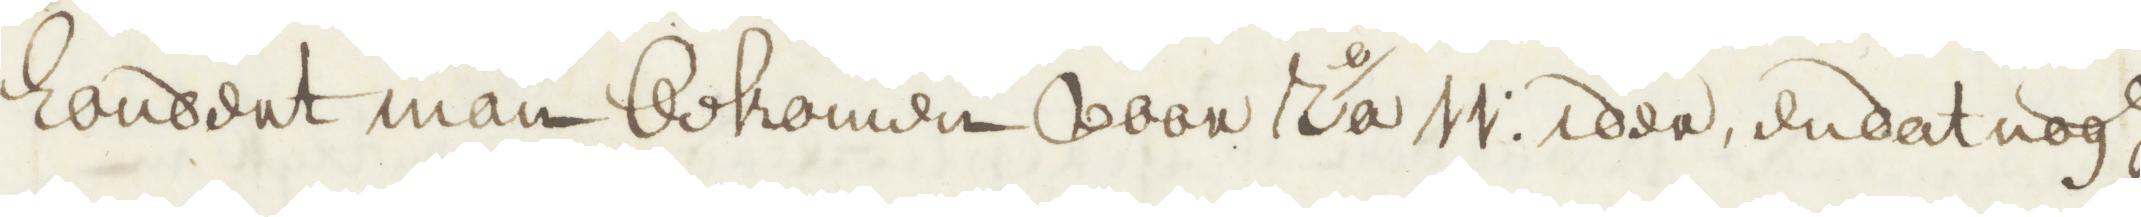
hondert man bekomen voor ro/a 11: ider, en dat nog
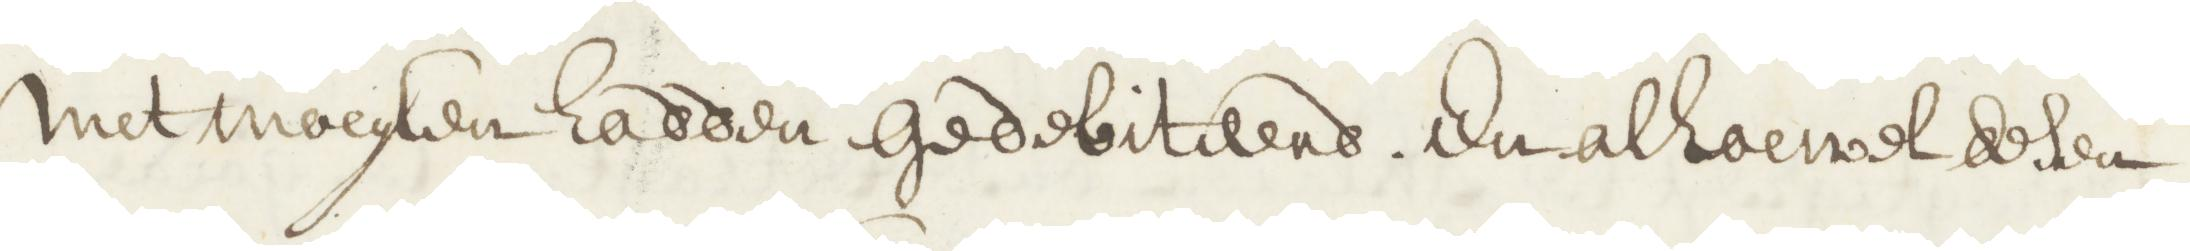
met moeyten hadden gedebiteerd. En alhoewel desen
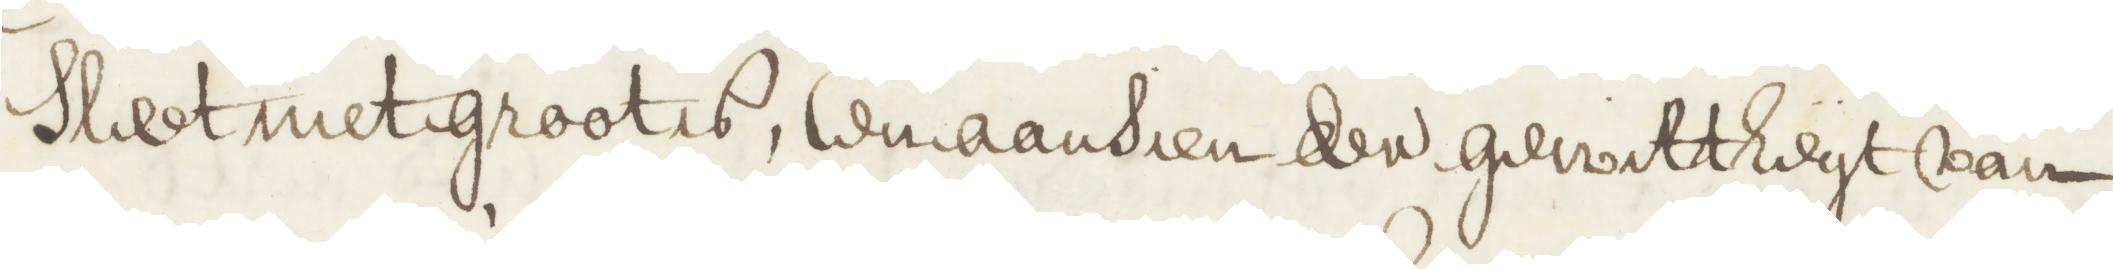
sleet niet groot is, ten aansien der gewiltheijt van
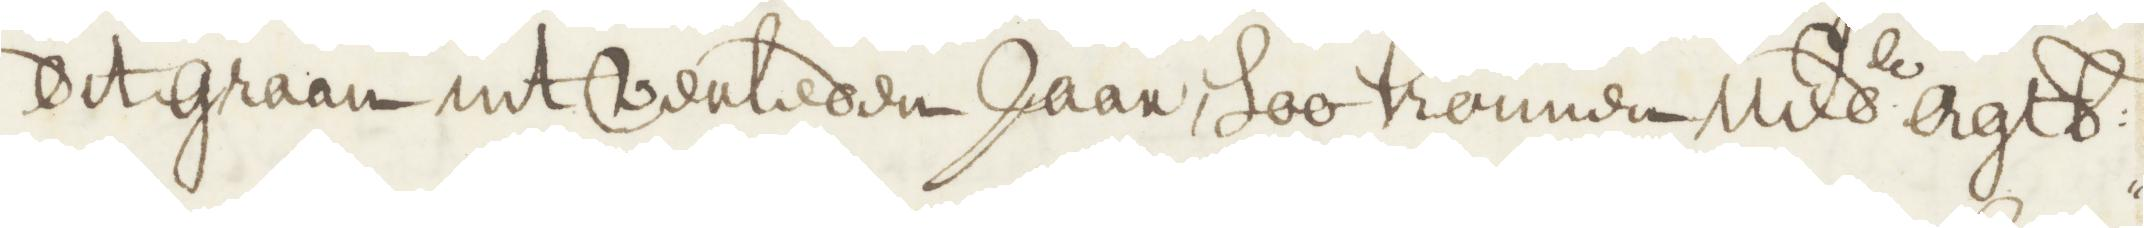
dit graan in 't verleden Jaar, soo konnen uEd:le agtb:
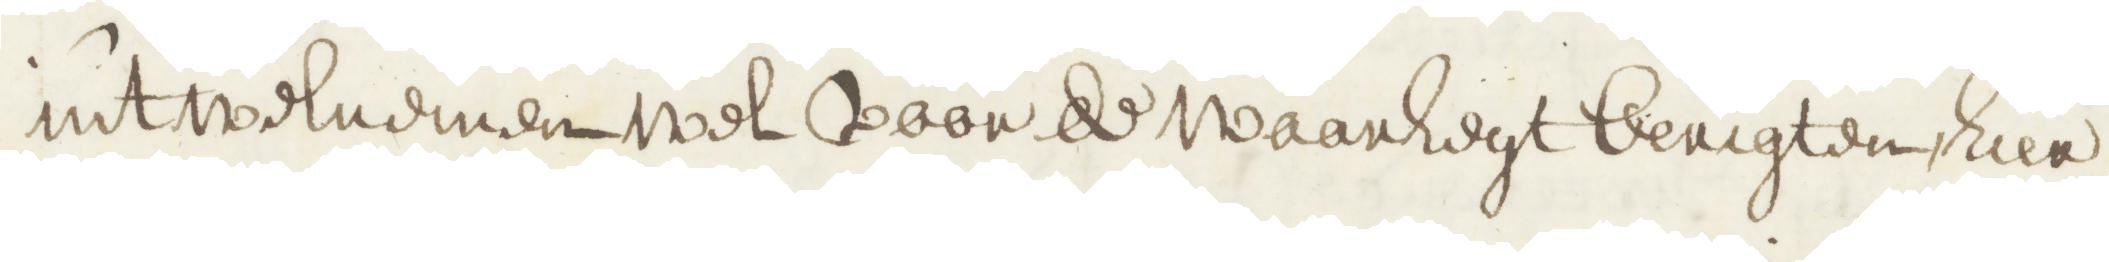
in 't welnemen wel voor de waarheijt berigten, hier
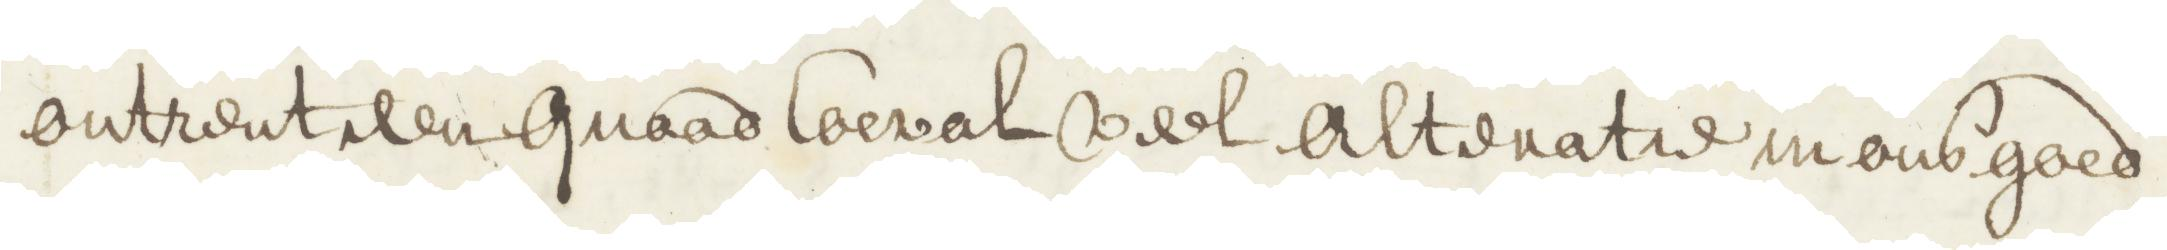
ontrent een quaad toeval veel alteratie in ons goed
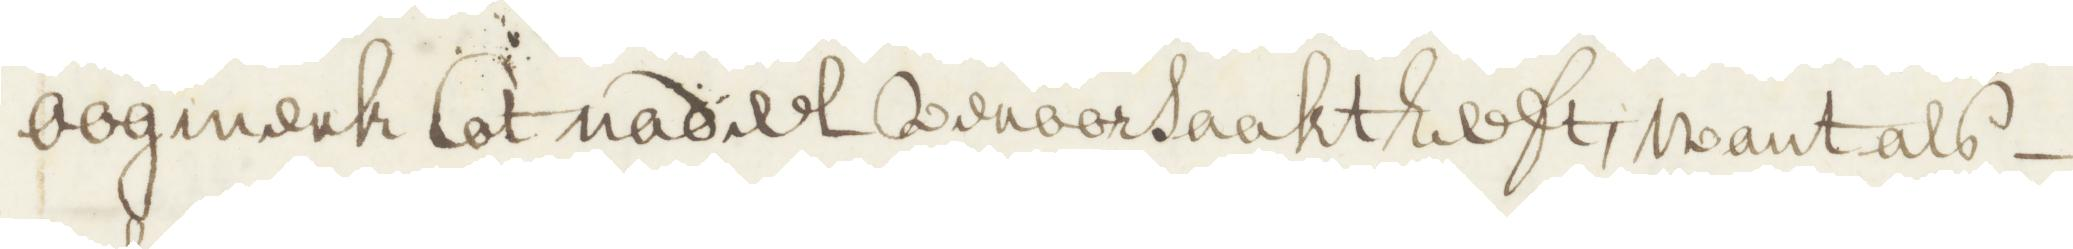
oogmerk tot nadeel veroorsaakt heeft, want als —
